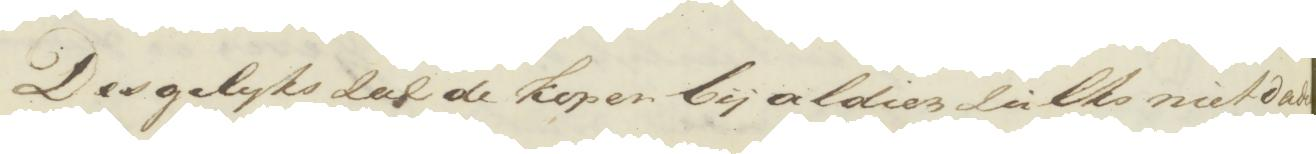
Desgelyks zel de koper bij aldien zulks niet daa
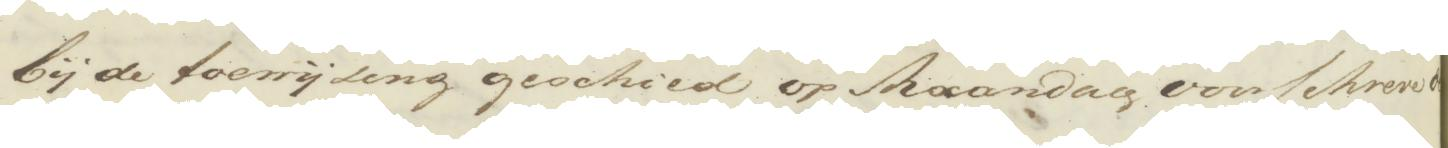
bij de toewijzing geschied op Maandag voorschreve d
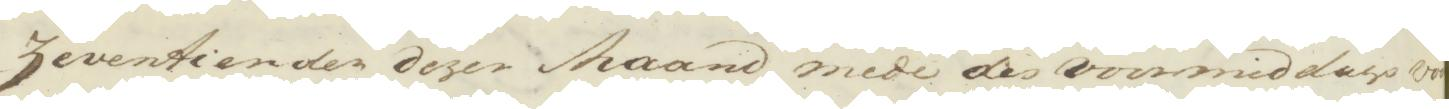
Zeventienden dezer Maand, mede des voormiddags vo
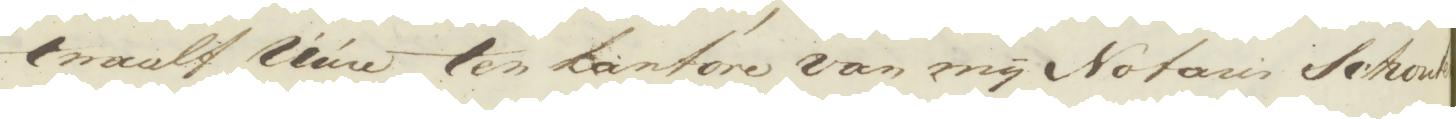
twaalf uur, ten kantore van mij Notaris Schoute
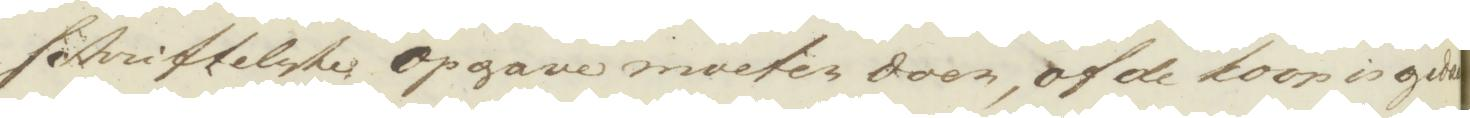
schriftelyke opgave moeten doen, of de koop is gete
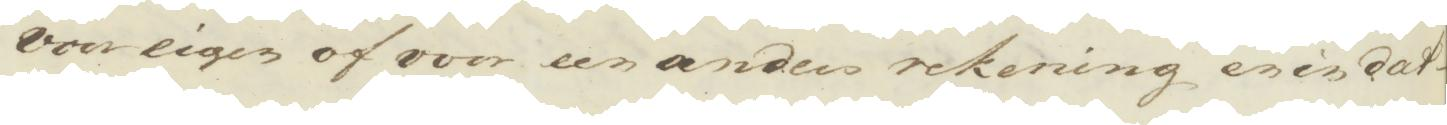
voor eigen of voor een anders rekening en in dat
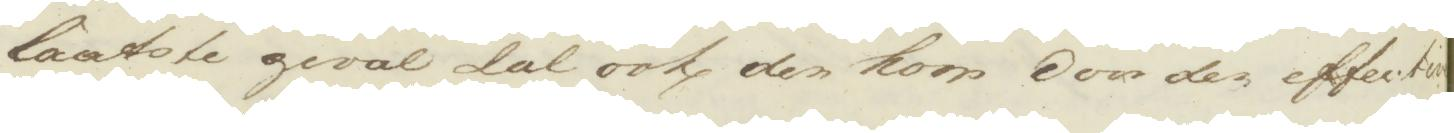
laatste geval zal ook den koop door den effectiv
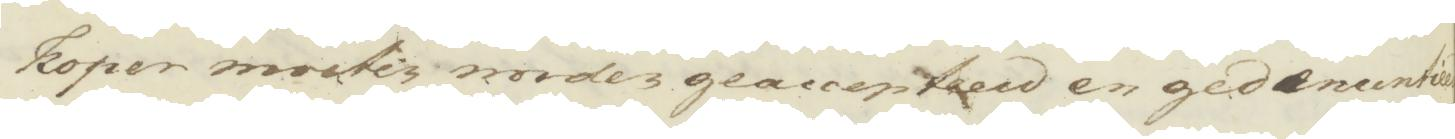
koper moeten worden geaccepteerd en gedenuntiee
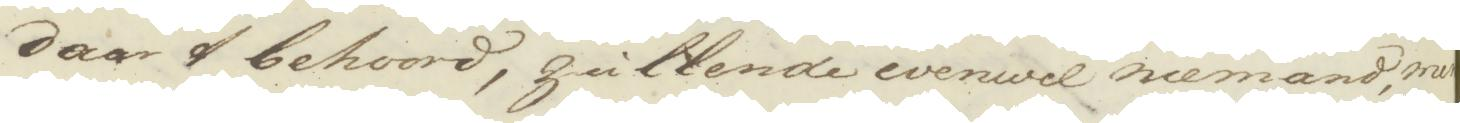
daar ’t behoord, zullende evenwel niemand, met
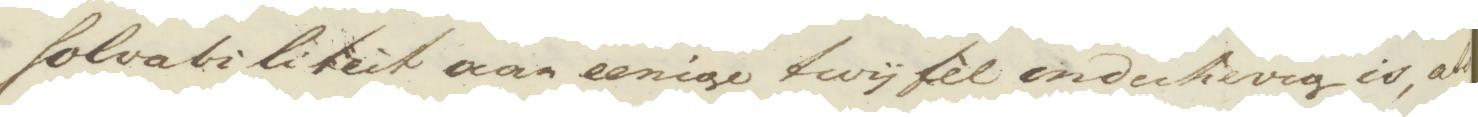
solvabiliteit aan eenige twijfel onderhevig is, als
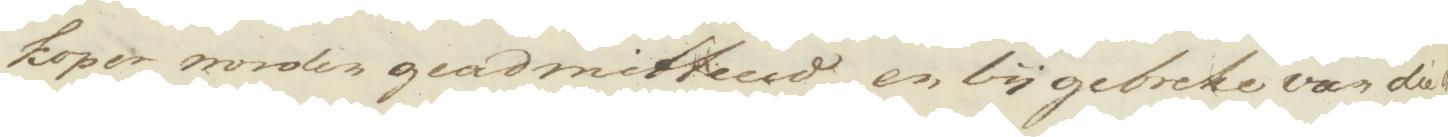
koper worden geadmitteerd, en bij gebreke van die
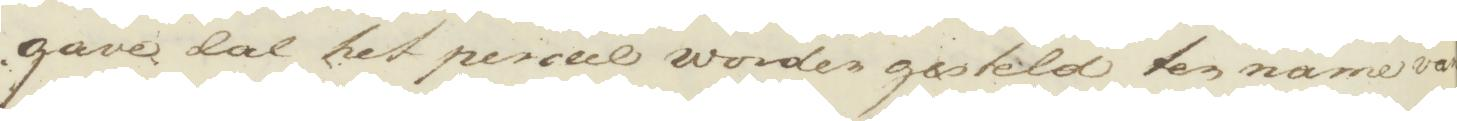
„gave zal het perceel worden gesteld ten name va
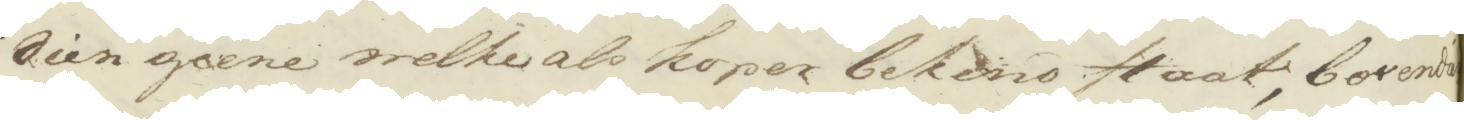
dien geene welke als koper bekend staat, bovend
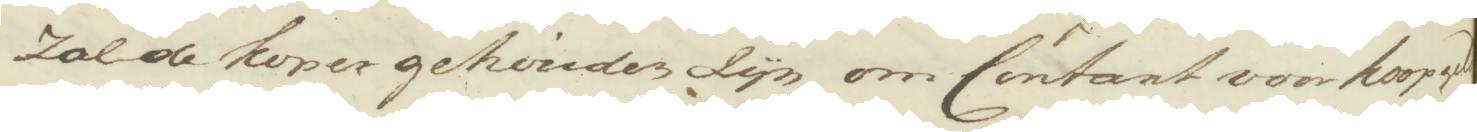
zal de koper gehouden zijn, om Contant voor koopgeld
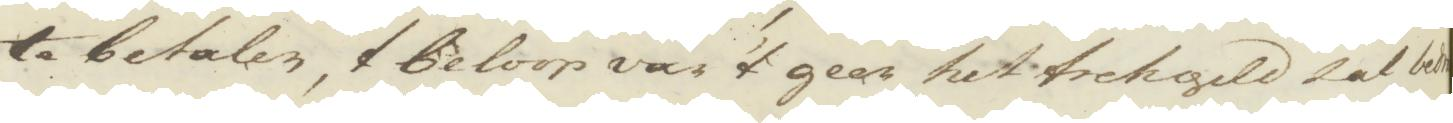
te betalen, t beloop van ’t geen het trekgeld zal bed
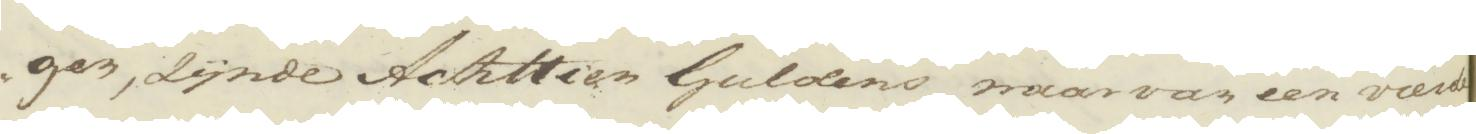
„gen, zijnde Achttien Guldens, waarvan een vierde
